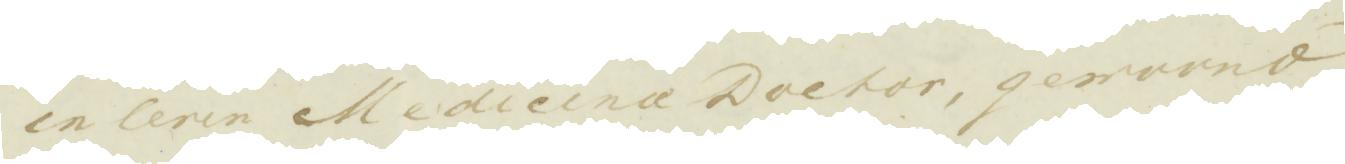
in leven Medicinae Doctor, gewoond
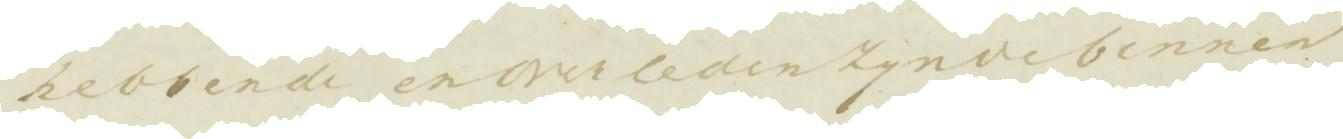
hebbende en overleden zijnde binnen
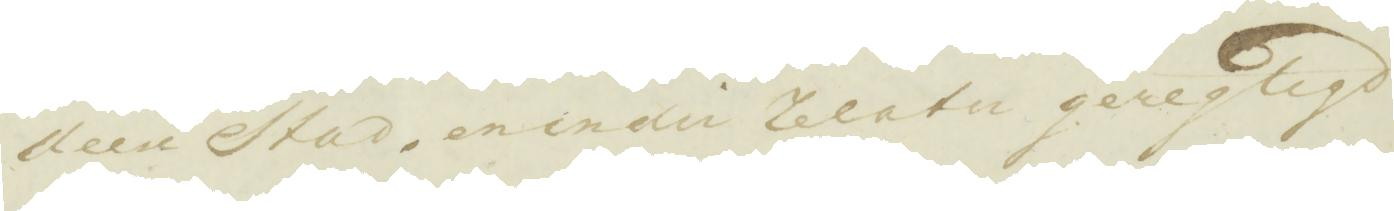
deese Stad, en in die relatie geregtigd
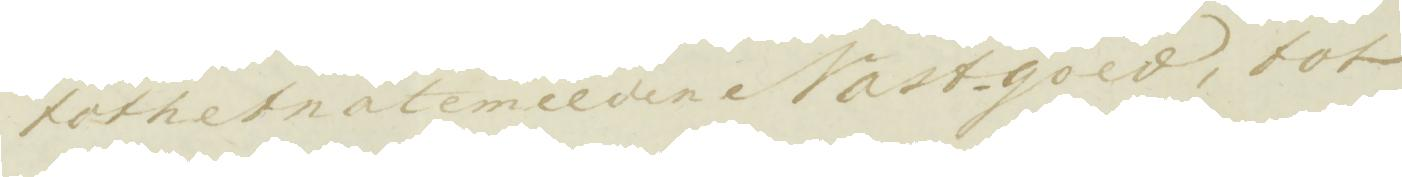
tot het natemelden Vast-goed, tot
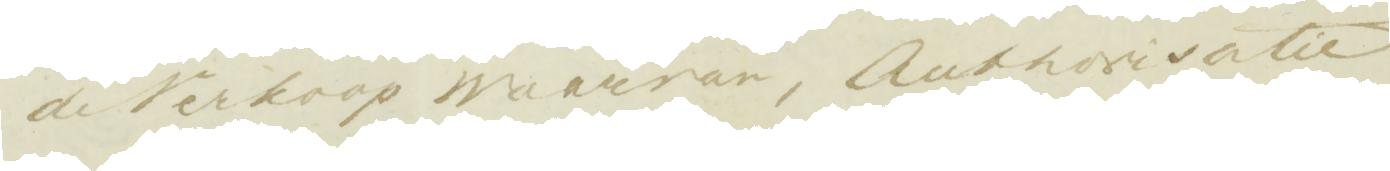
de Verkoop waarvan, Authorisatie
